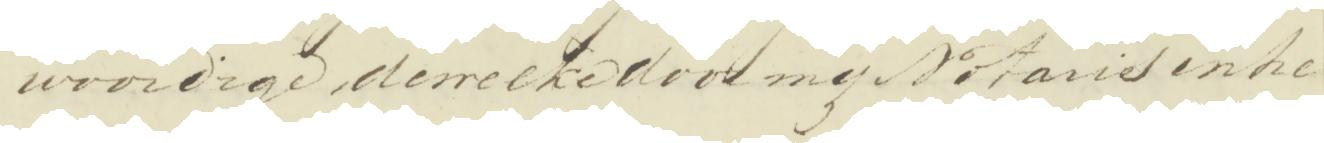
woordige, dewelke door my Notaris in he
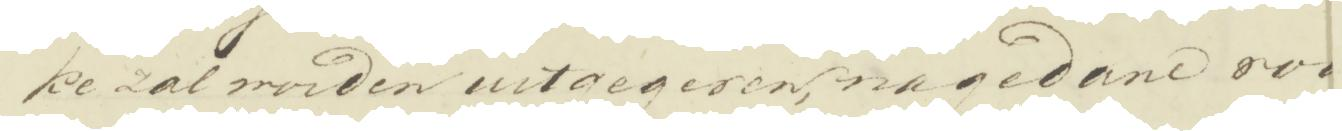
ke zal worden uitgegeven, na gedane vor
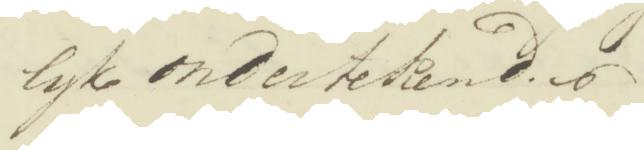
lyk ondertekend.
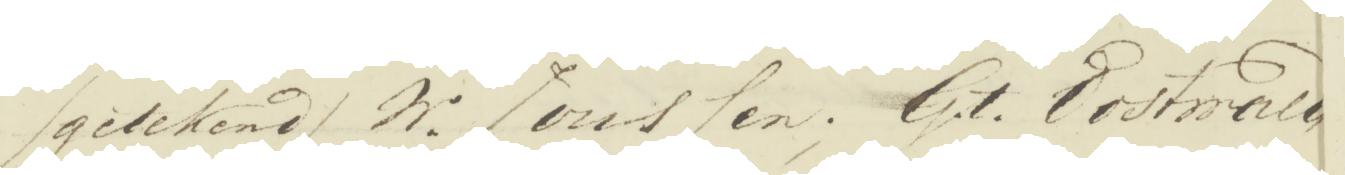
/getekend/ W. Joussen: Gt. Oostwald
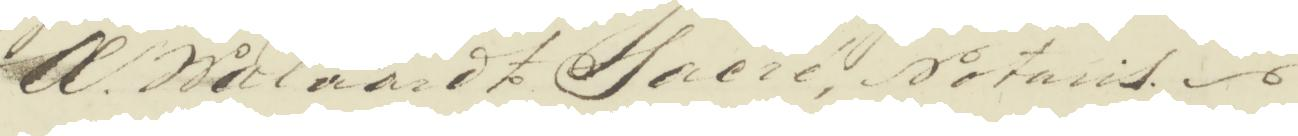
Ae: Walaardt Sacré, Notaris.
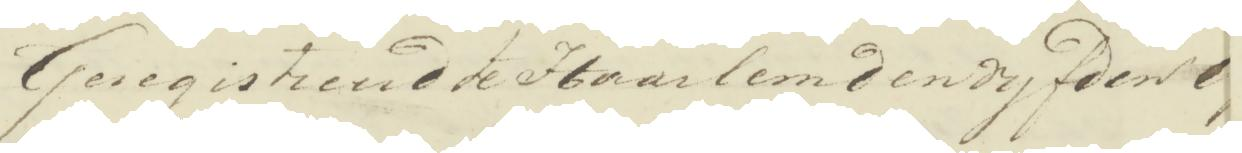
Geregistreerd te Haarlem den vyfden t
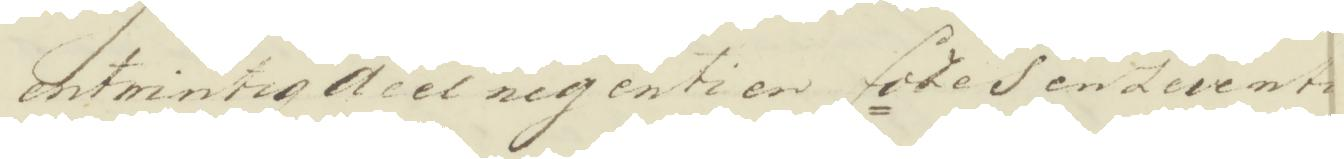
entwintig deel negentien f=o Zes en Zevent
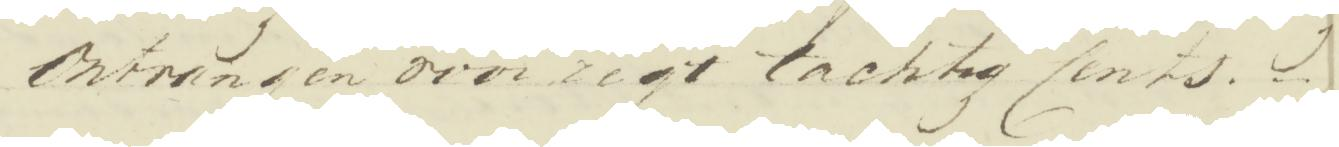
Ontvangen voor regt tachtig Cents. I
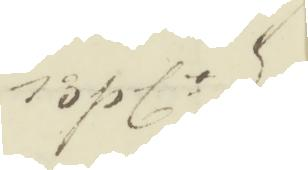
13 pC:t
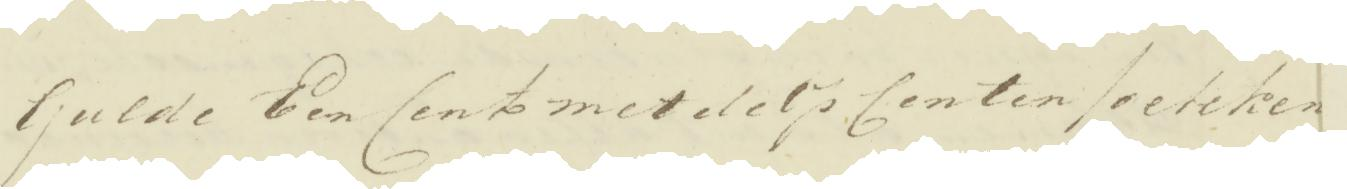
Gulde Een Cent met de Op Centen /geteken
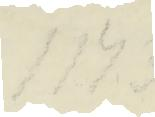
1173
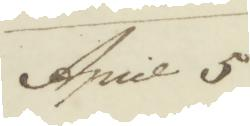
April 5
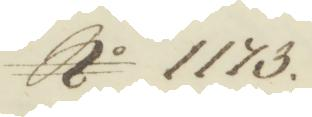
N=o 1173.
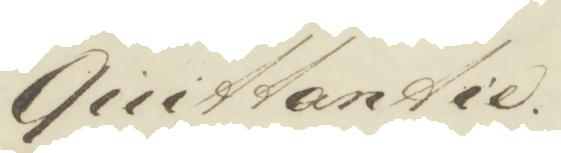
Quittantie.
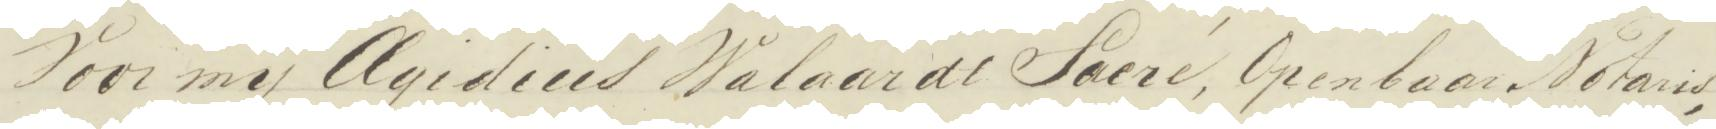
Voor my Aegidius Walaardt Sacré, Openbaar Notaris,
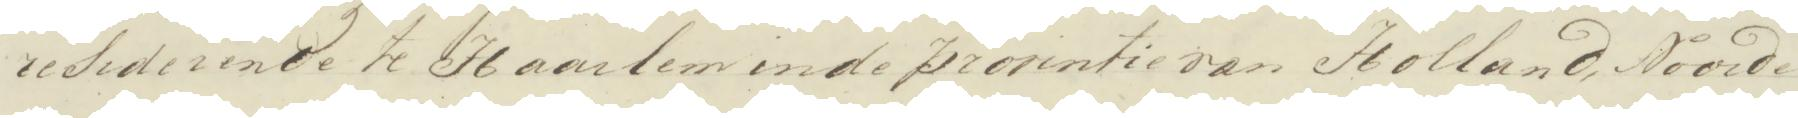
residerende te Haarlem in de provintie van Holland, Noorde
